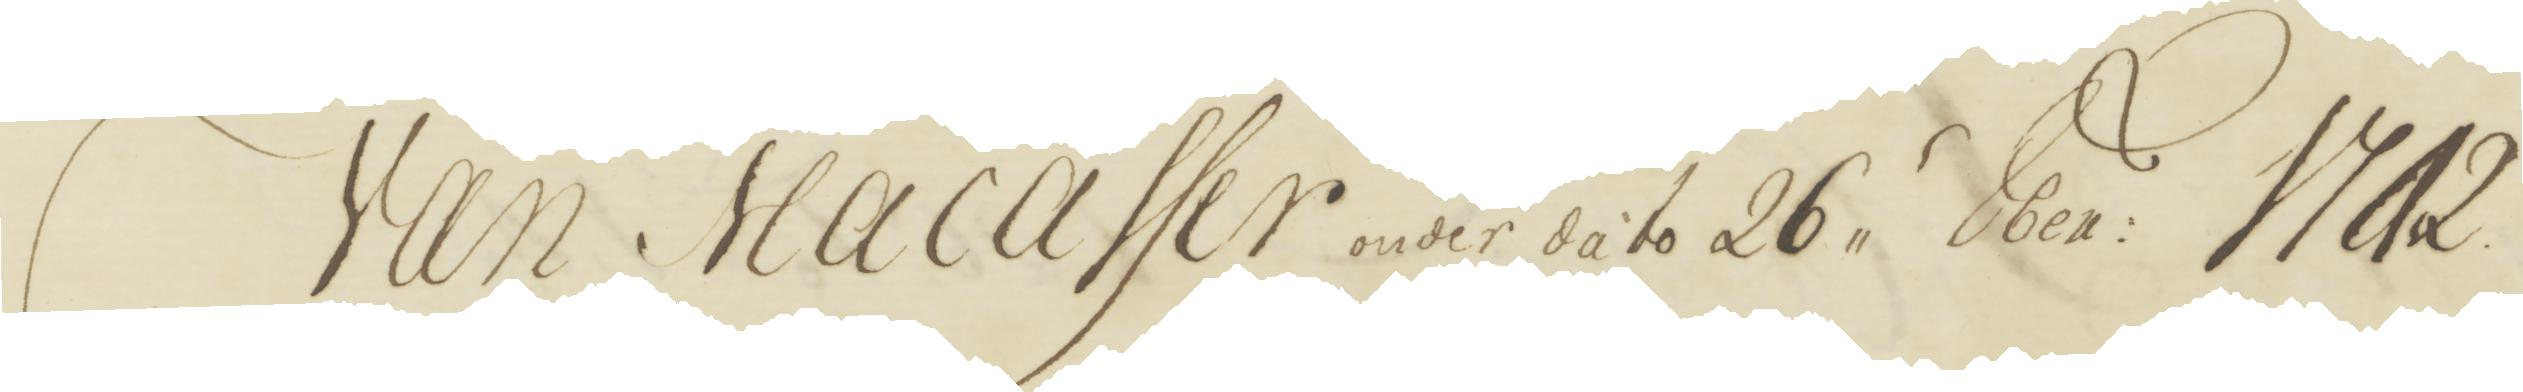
Van Macasser onder dato 26„' 8ber: 1742.
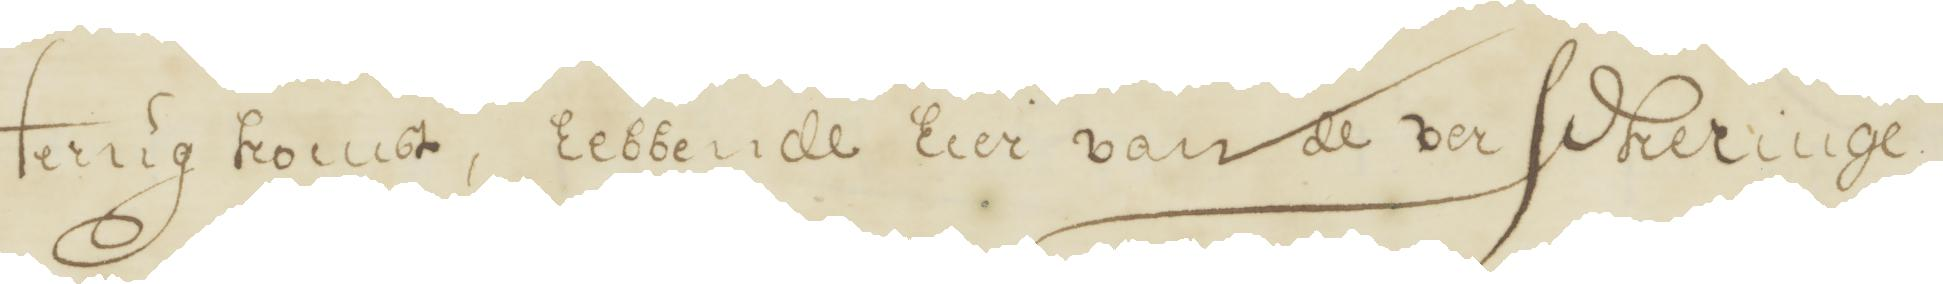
terug komst, hebbende hier van de versekeringe
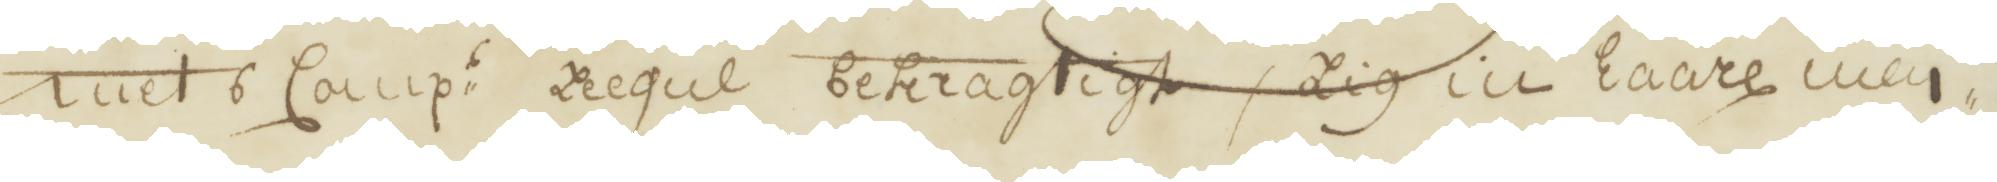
met ’s Comp:s zeegul bekragtigt, zig in haare men„
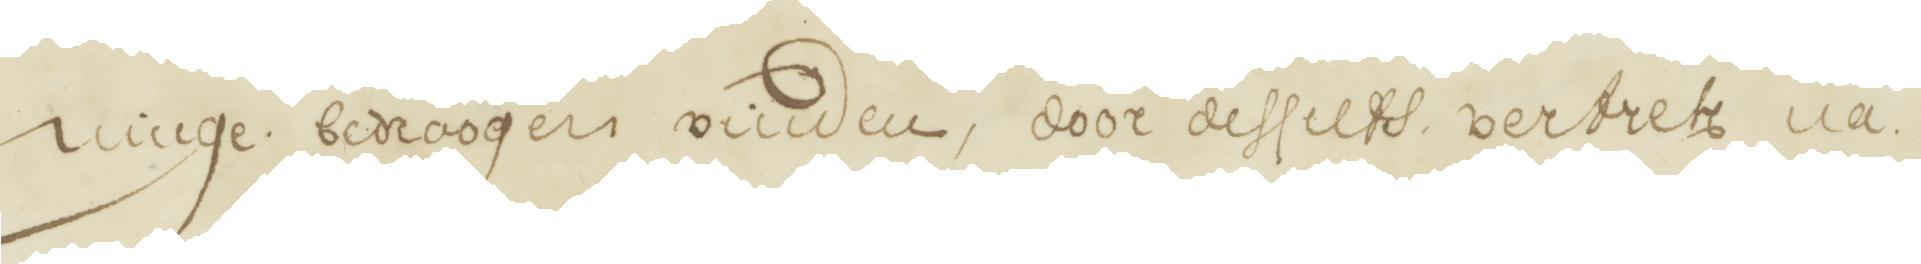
ninge bedroogen vinden, door desselfs vertrek na.
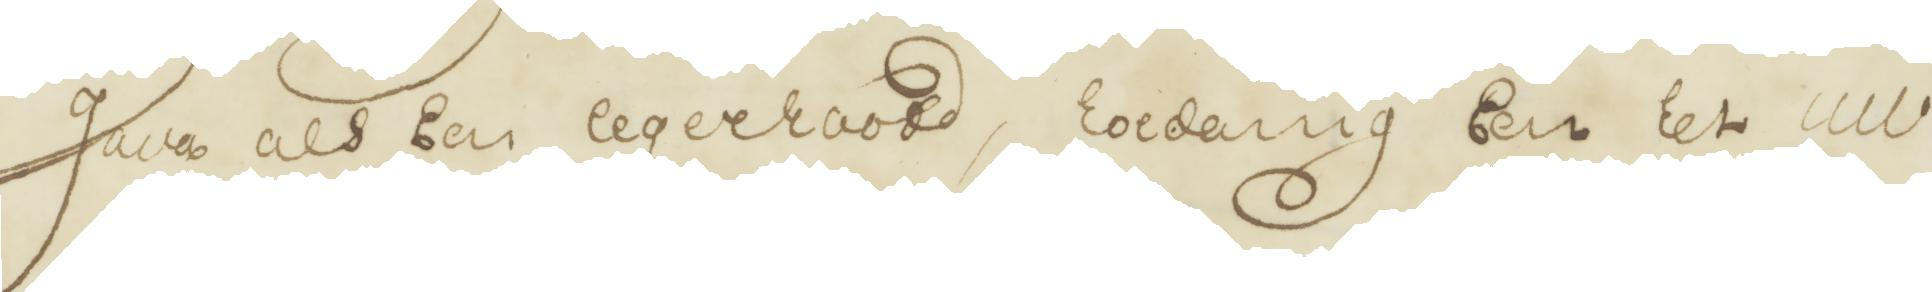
Java als Een legerhoofd, hoedanig Een het uw
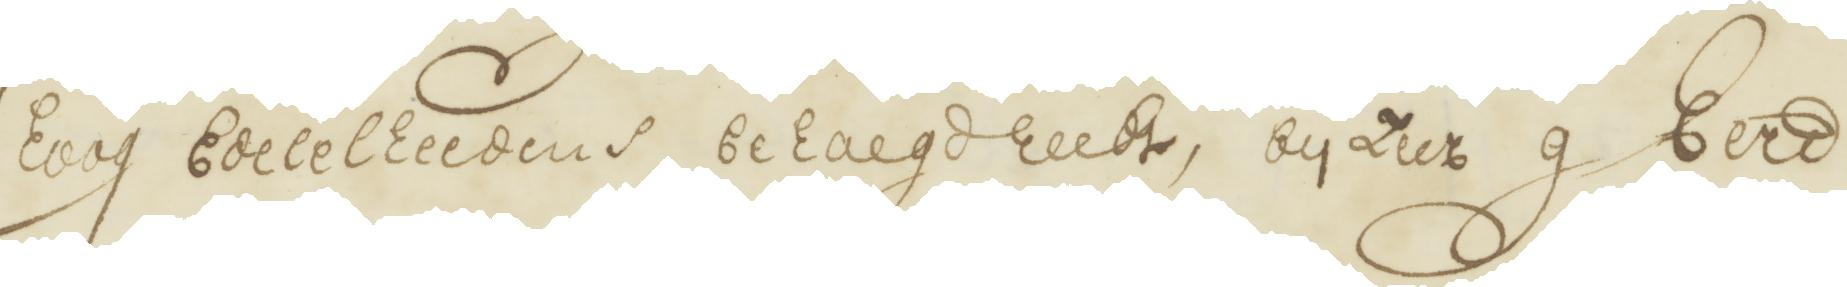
hoog Edelelheedens behaegd heeft, bij zeer g’Eerd
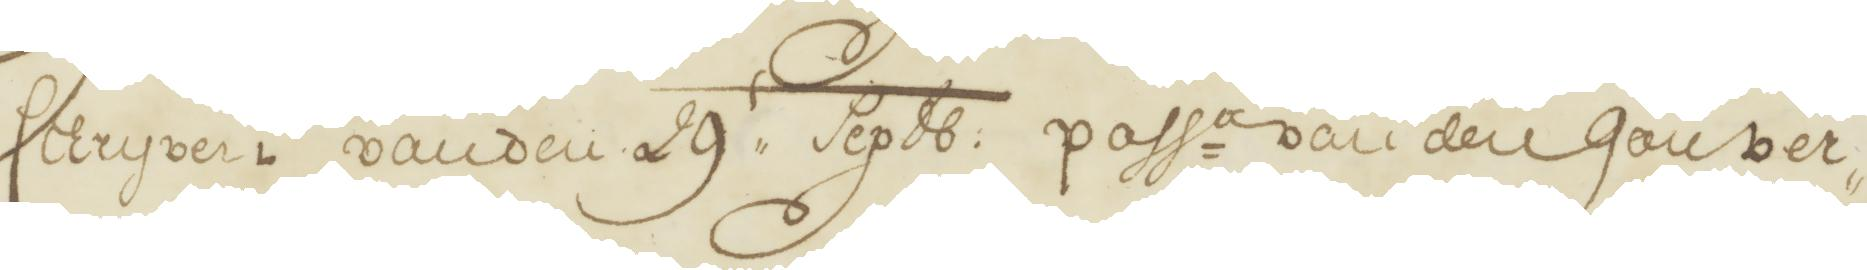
schrijven van den 29:' Septb: pass=o van den gouver„
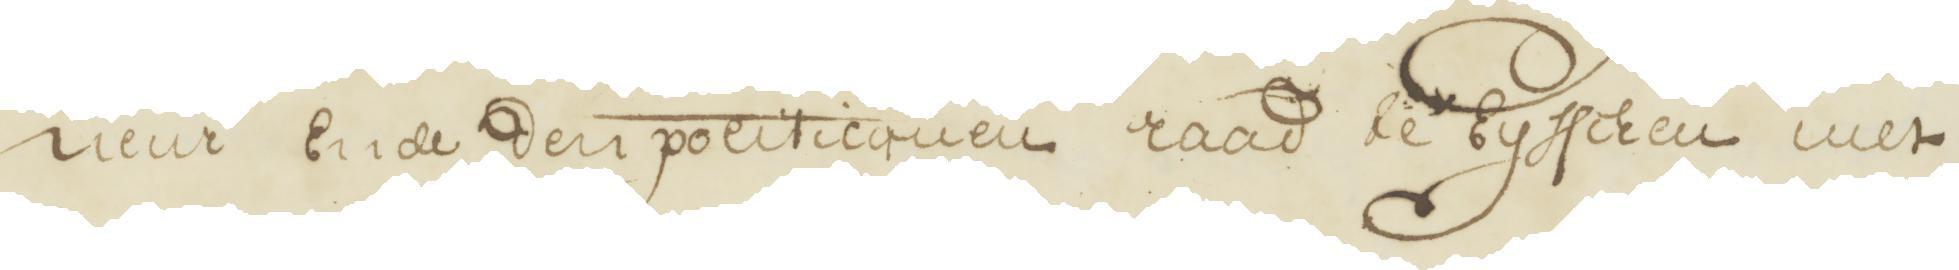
neur Ende den politicquen raad de Eijsschen met
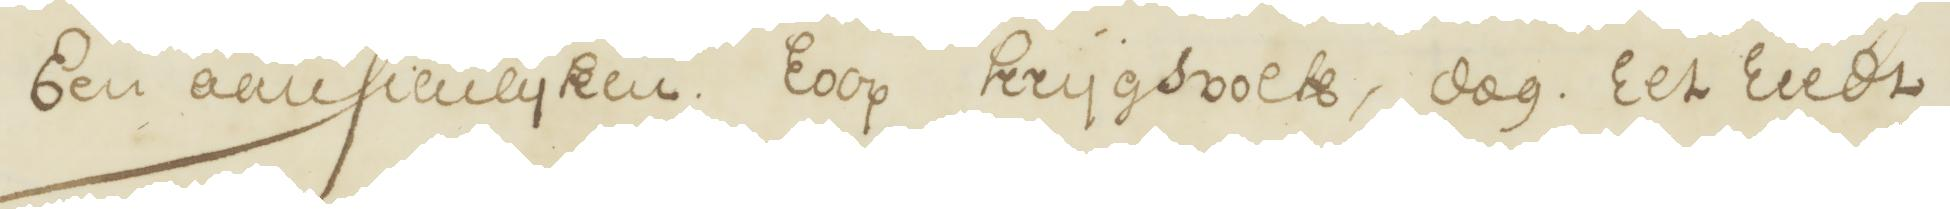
Een aansienlyken. hoop krijgsvolk, dog. het heeft
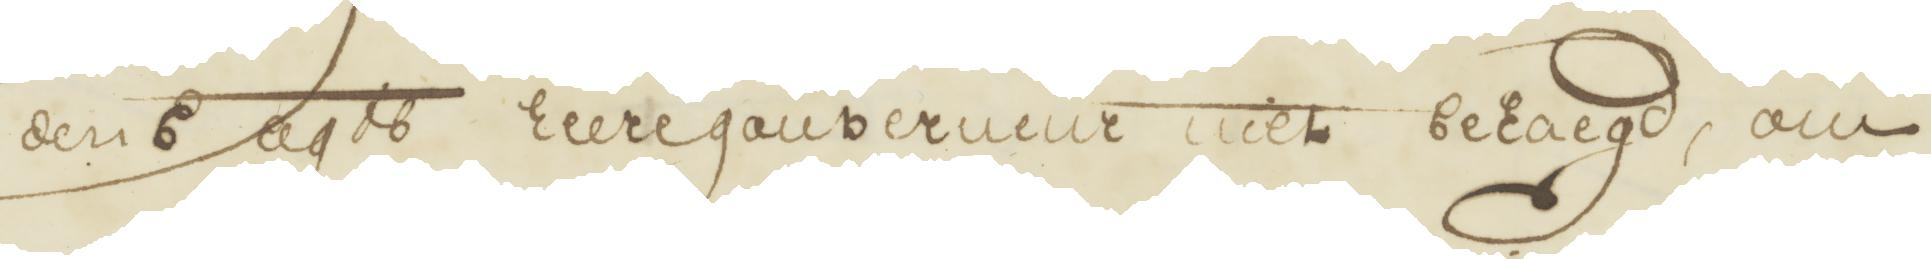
den E agtb heere gouverneur niet behaegd, om
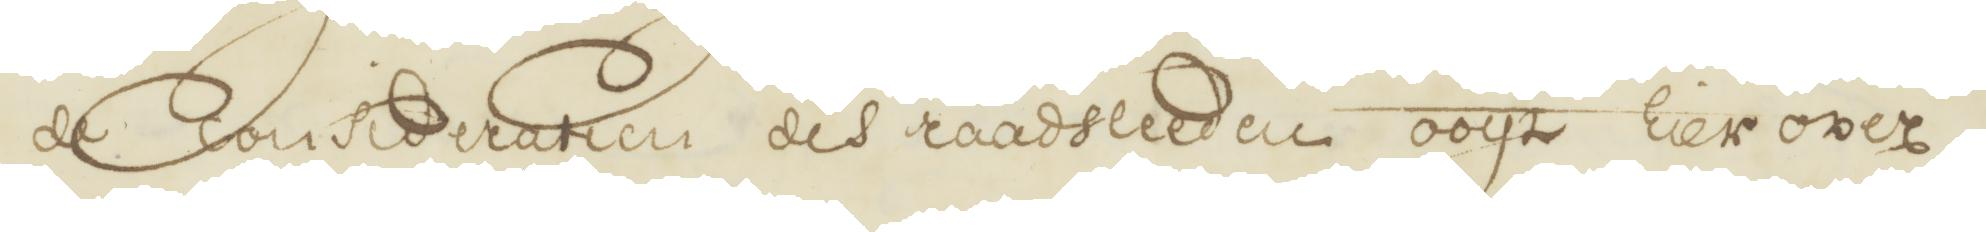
de consideratien des raadsleeden ooijt hier over
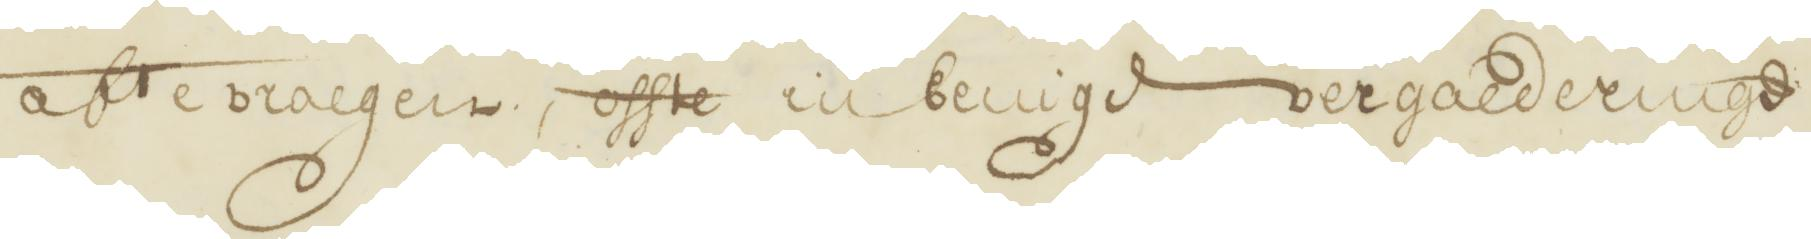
afte vraegen, offte in Eenige vergaederinge
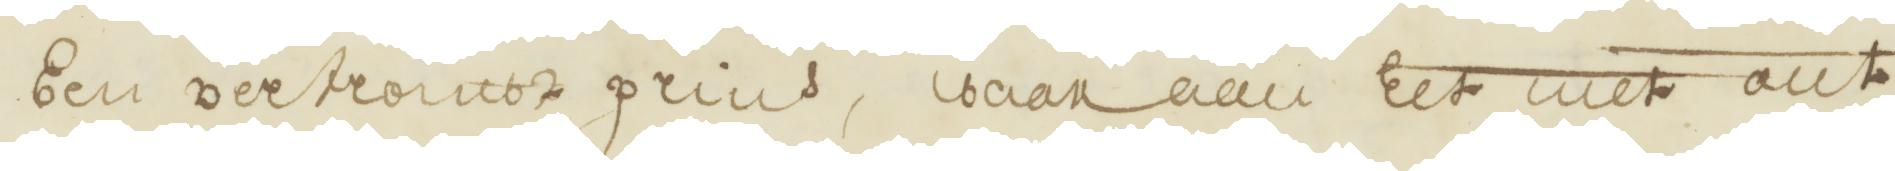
Een vertrouten prins, waar aan het niet ont
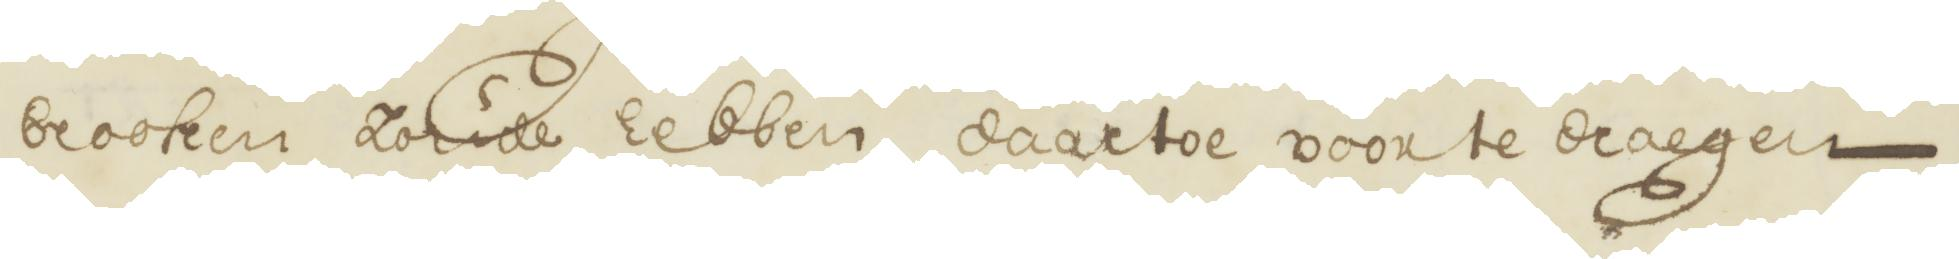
brooken zoude hebben, daartoe voor te draegen
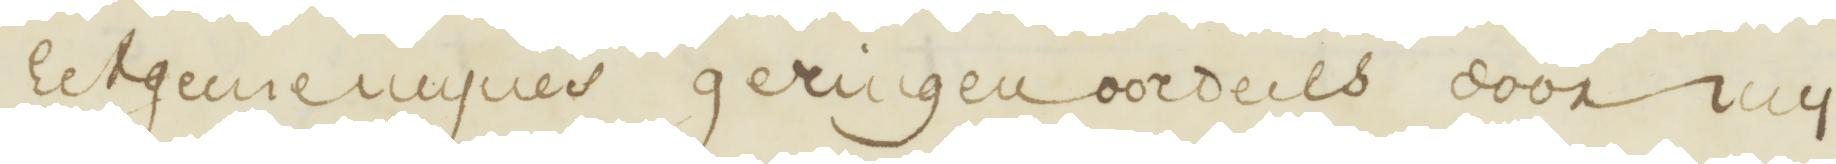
het geene mijnes geringen oordeels door my
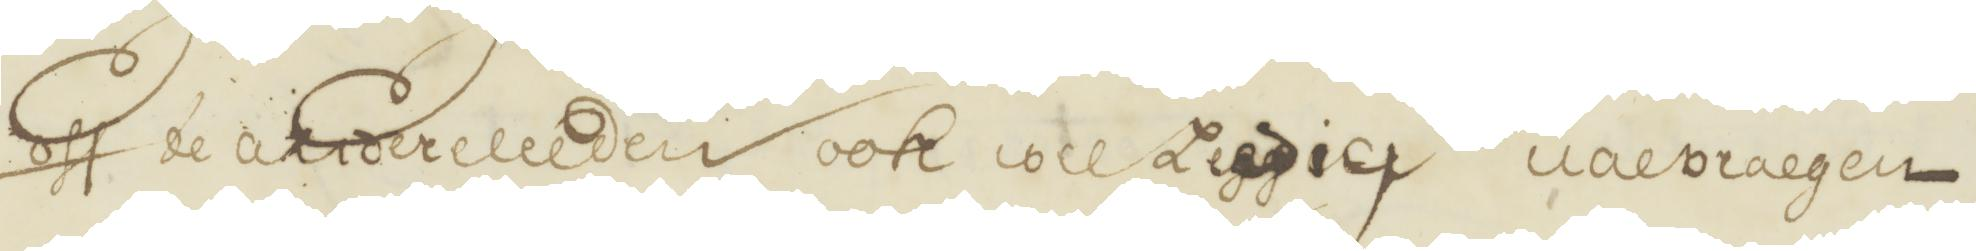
off de andereleeden ook wel zeedig naevraegen
